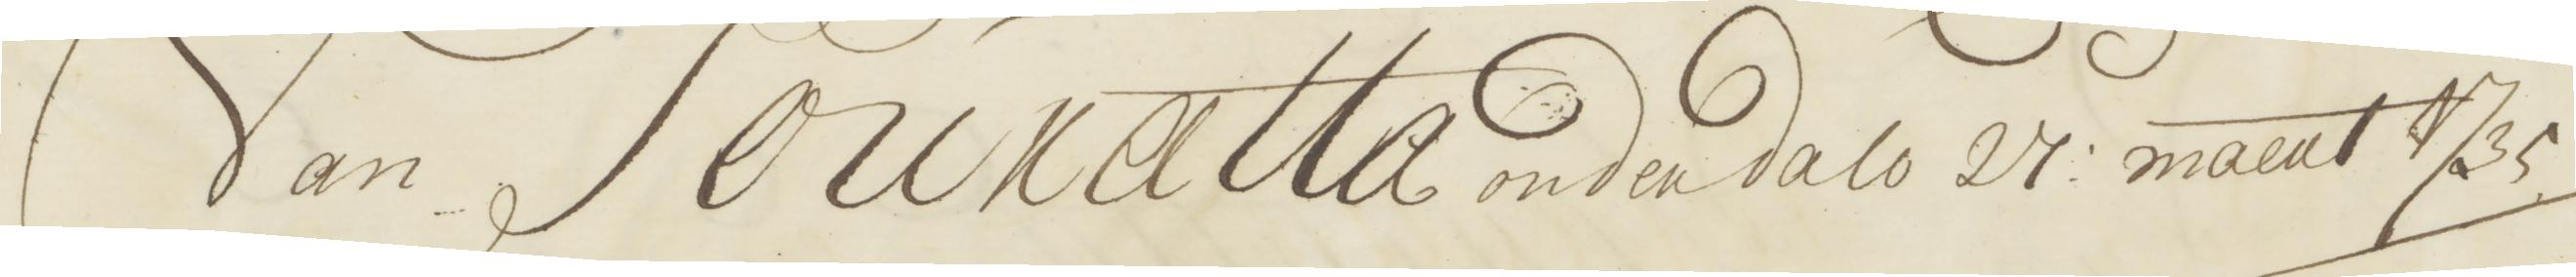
Van Souratta onderdato 27:e maert 1735.
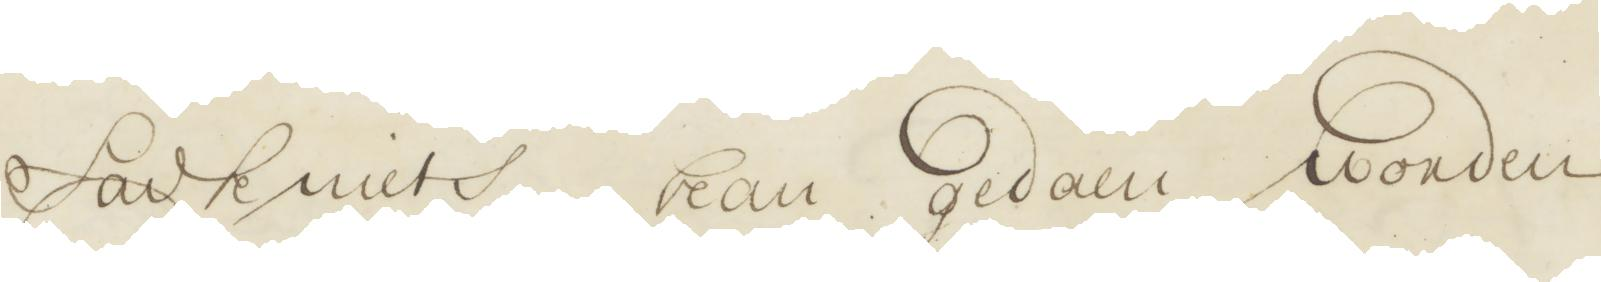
Saek niets kan gedaen worden
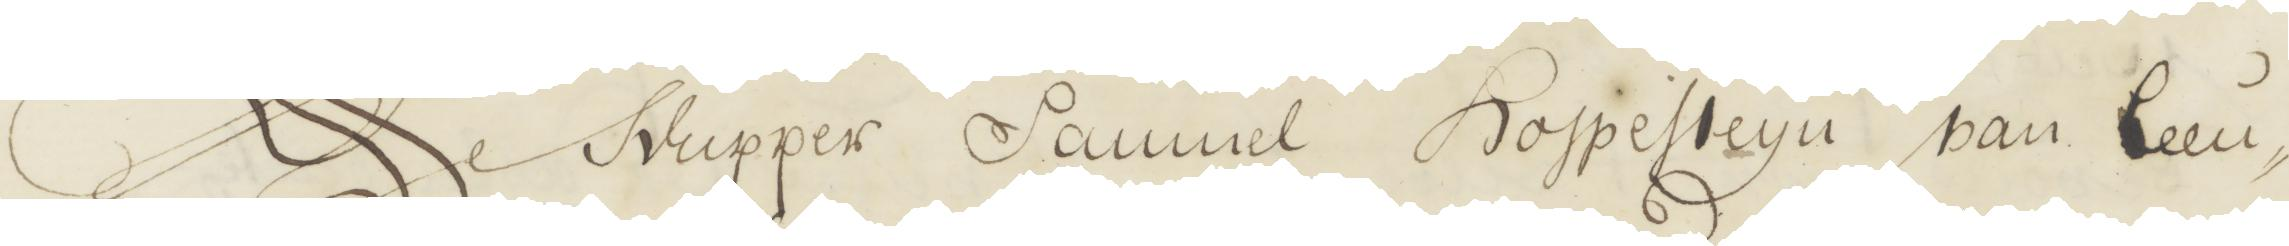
De schipper Samuel Hoppesteyn van Leeu„
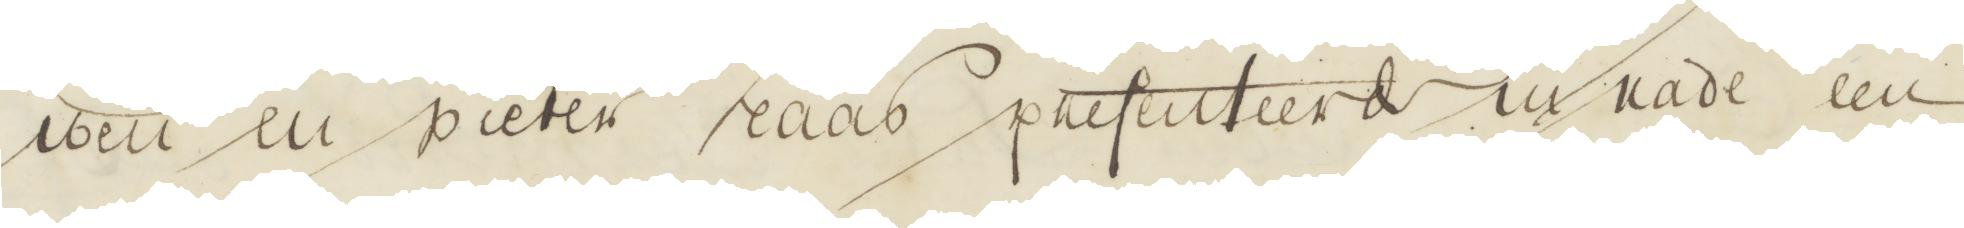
wen en pieter kaas presenteerde in rade een
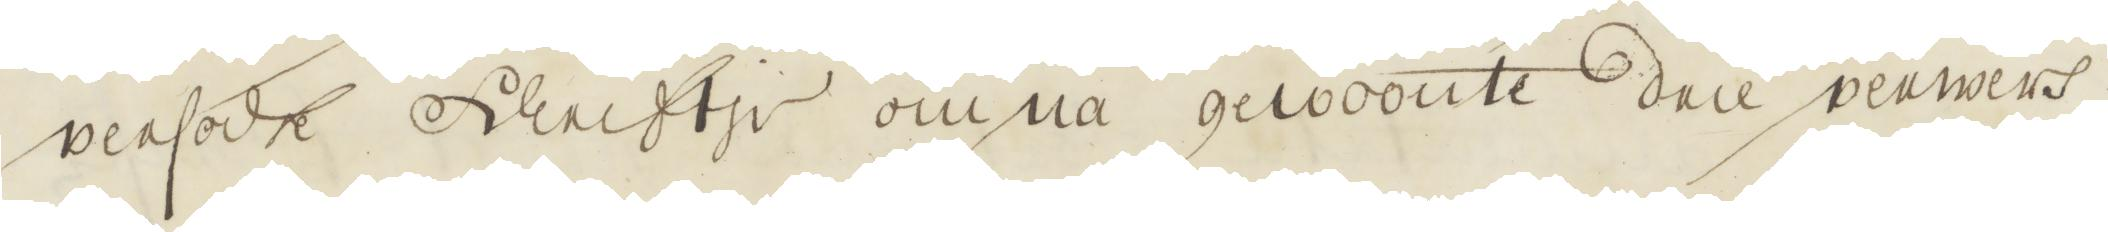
versoek schriftje om na gewoonte drie verwers
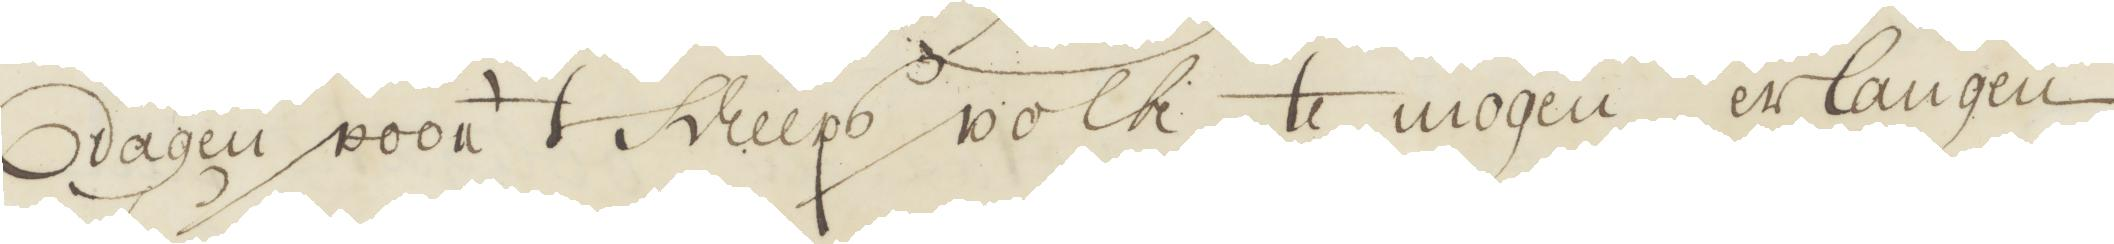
dagen voor ’t scheeps volk te mogen erlangen
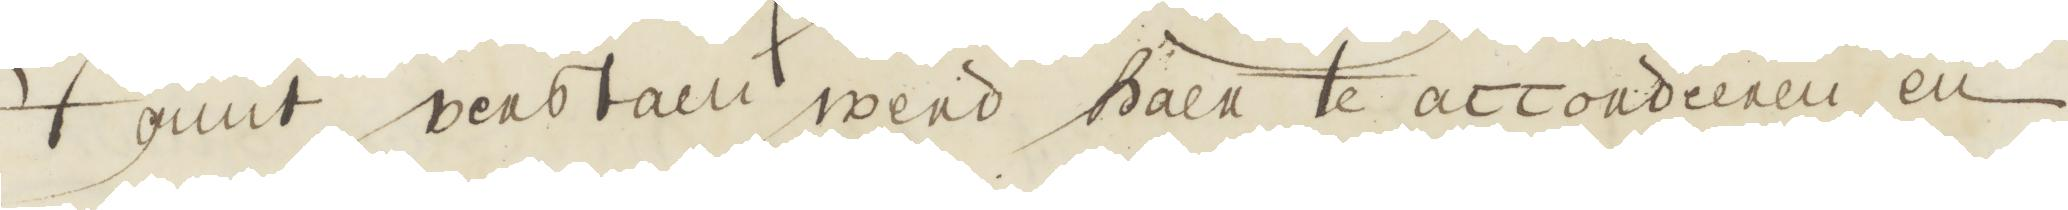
't gunt verstaen werd haer te accordeeren en
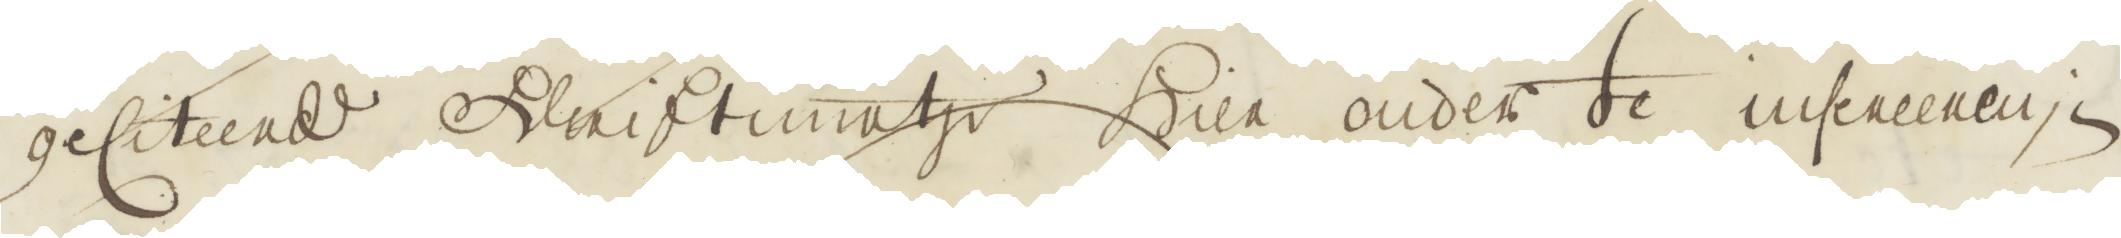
geciteerde schriftuurtje Hier onder te insereeren; —
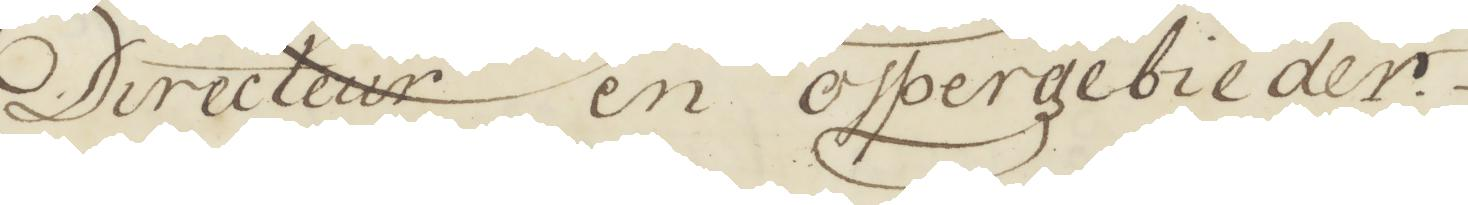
Directeur en oppergebieder. —
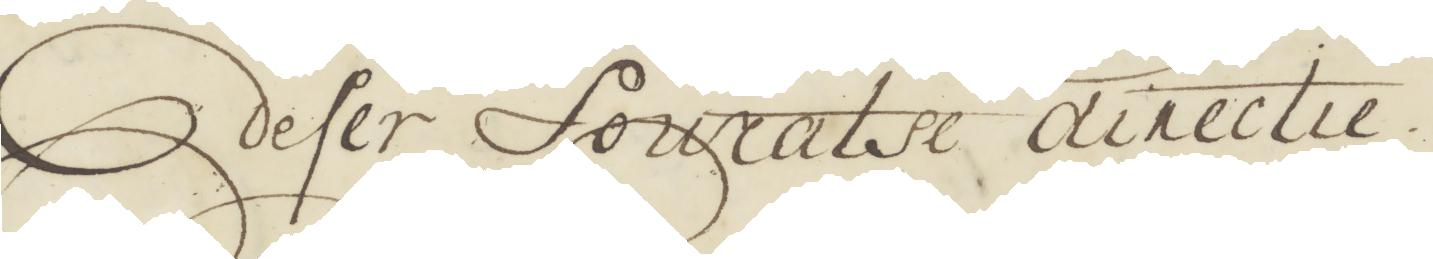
deser Souratse directie.
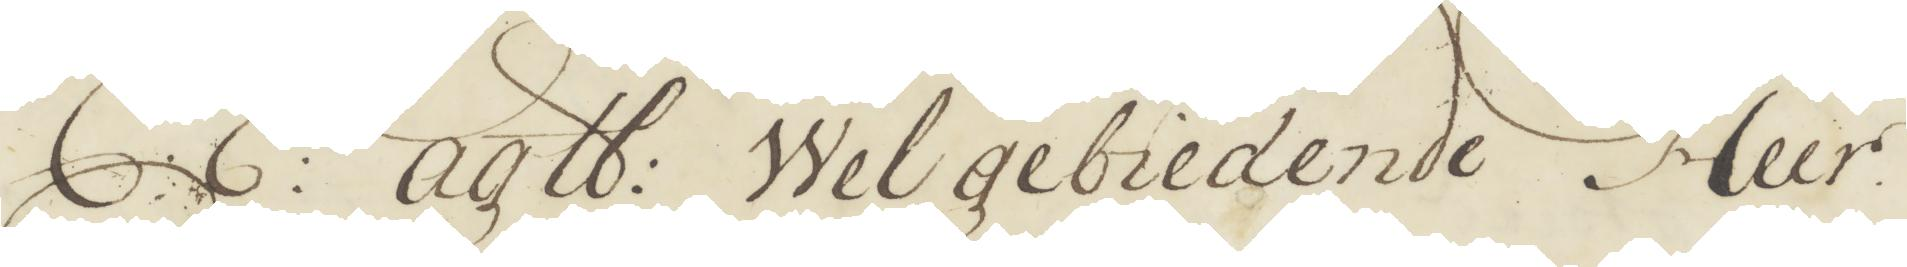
E:E: agtb: Wel gebiedende Heer
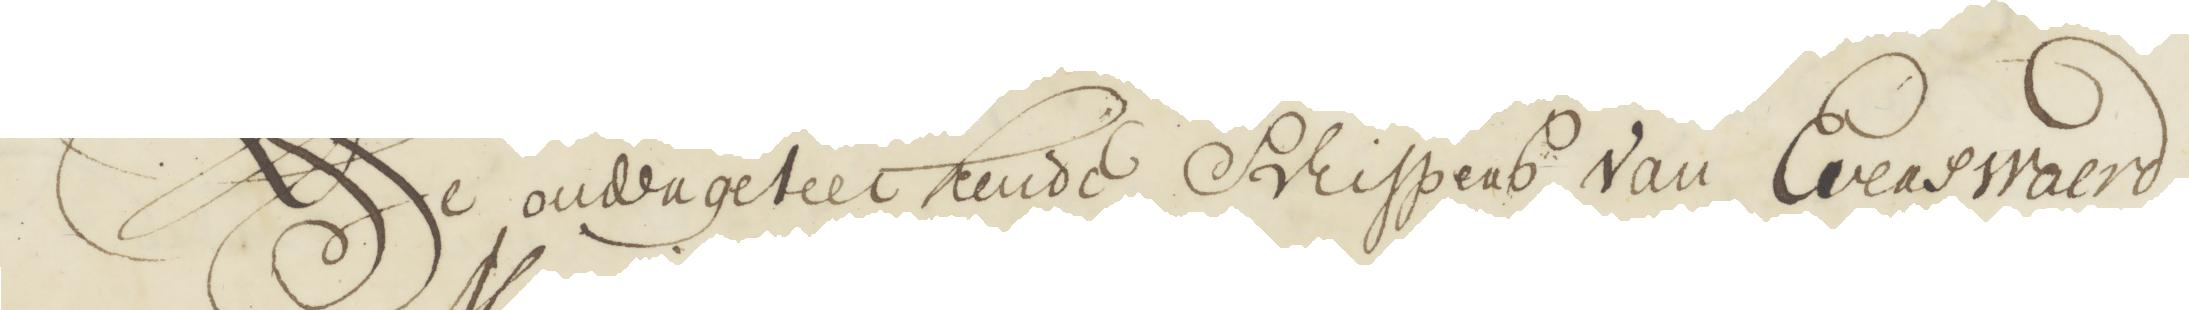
De ondergeteeckende schippers Van Everswaerd
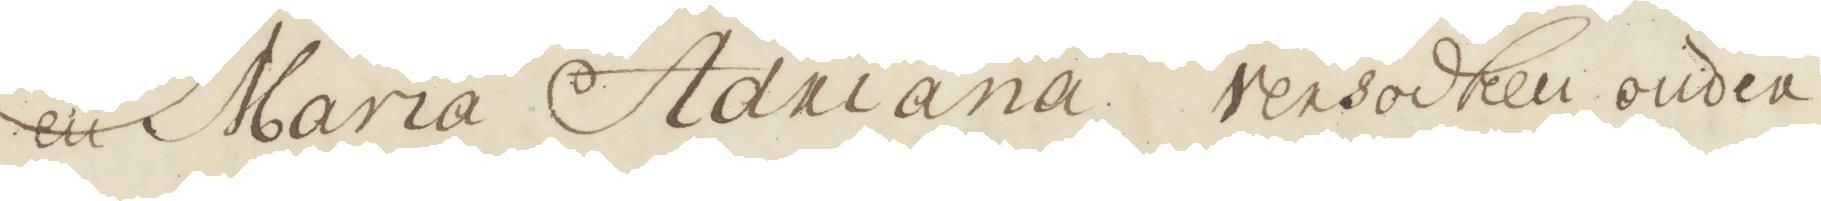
en Maria Adriana versoeken onder
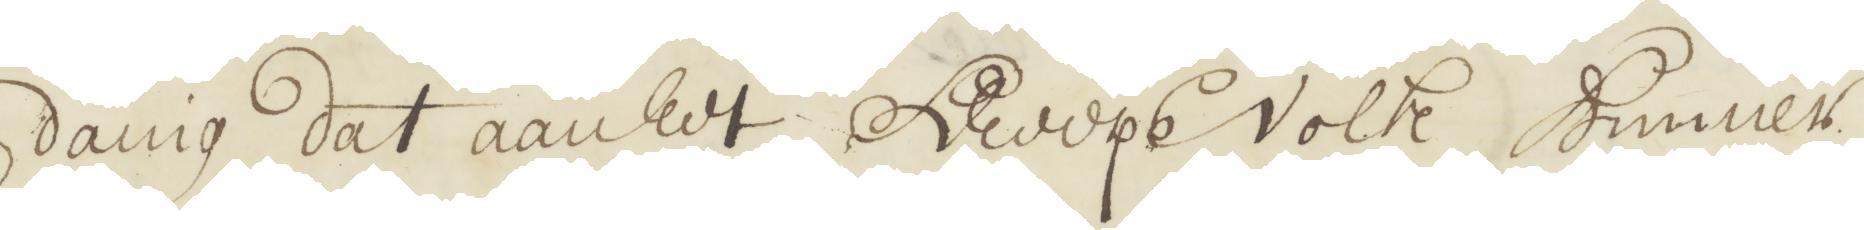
danig dat aan het Scheeps Volk Hunner
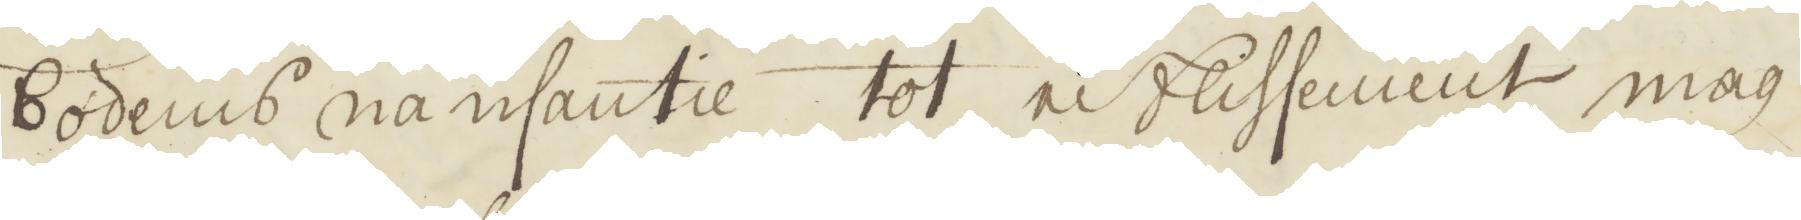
bodems na usantie tot reflissement mag
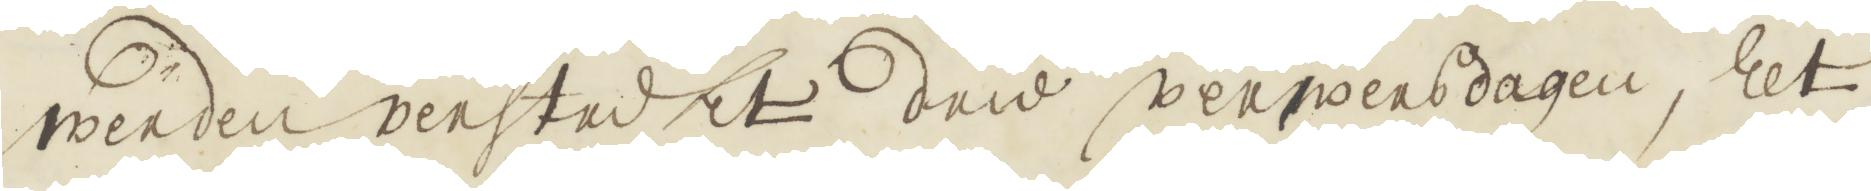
werden verstrekt drie verwersdagen, het
